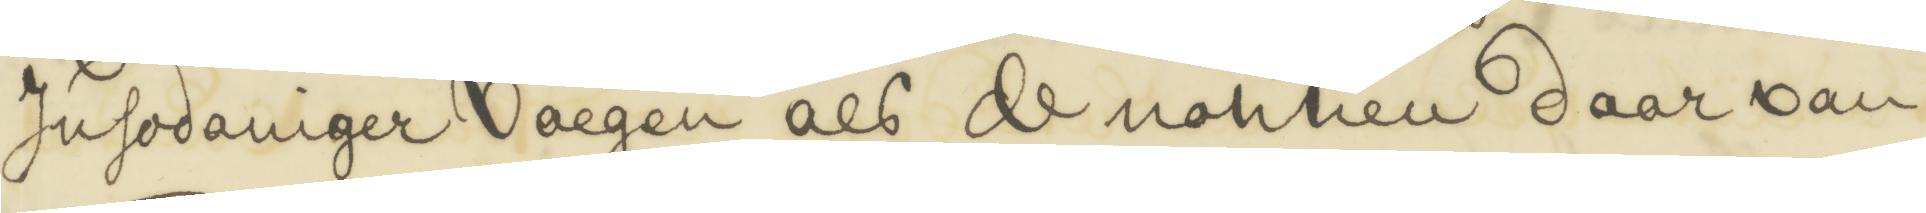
Jnsodaniger Voegen als de notitien daar van
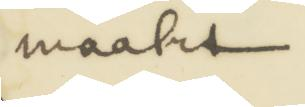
maakt.
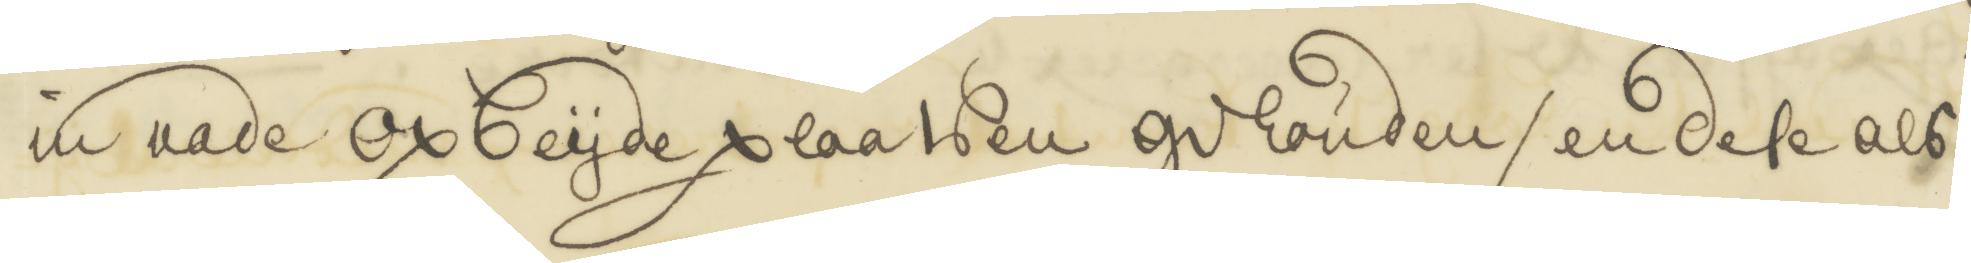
in rade op beijde plaatsen gehouden / en dese als
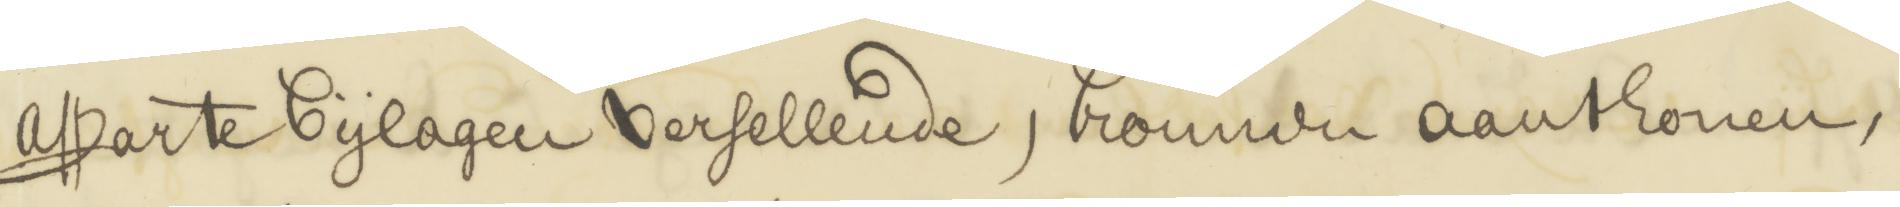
apparte bijlagen versellende, konnen aanthonen,
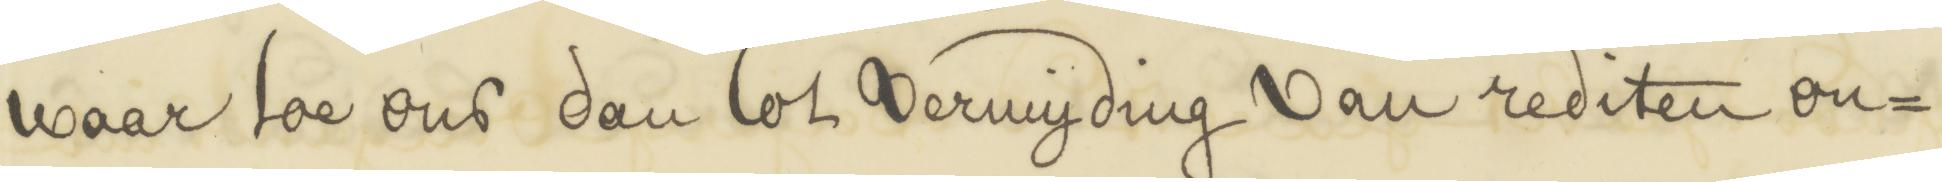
waar toe ons dan tot vermijding van rediten on=
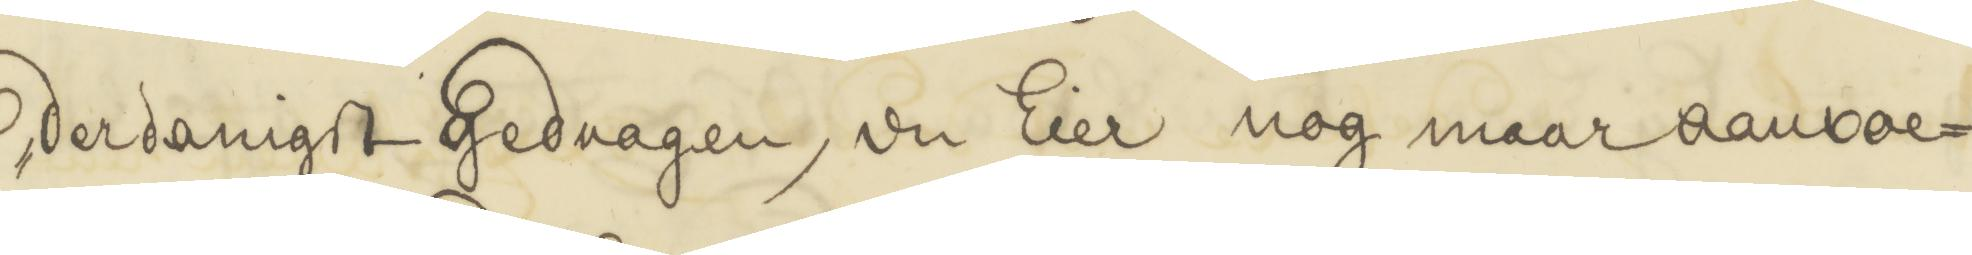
„derdanigst gedragen, en hier nog maar aanvoe=
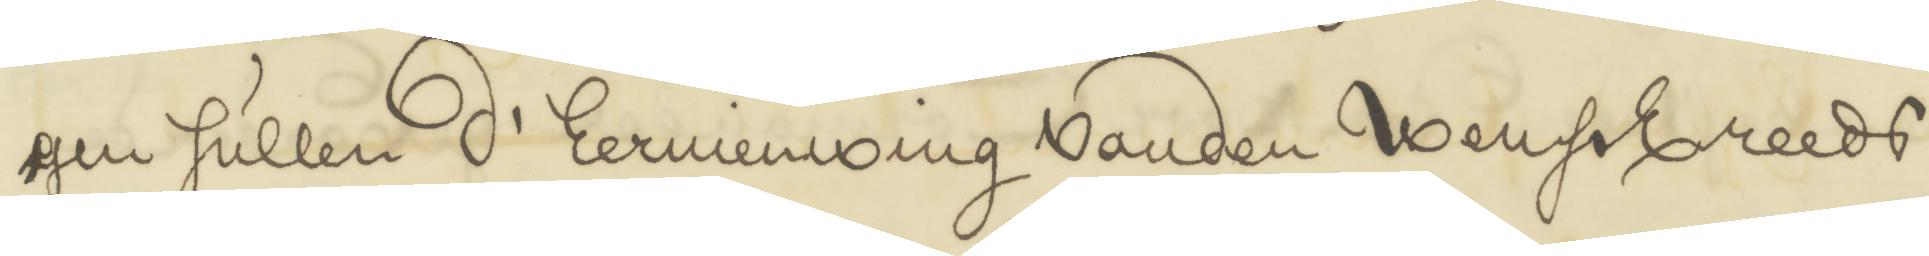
„gen sullen d’ hernieuwing vanden wensch reeds
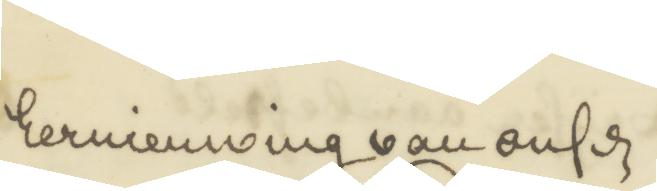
hernieuwing van onsen
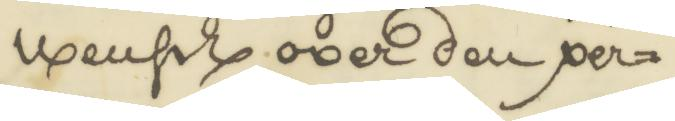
wensch over den per=
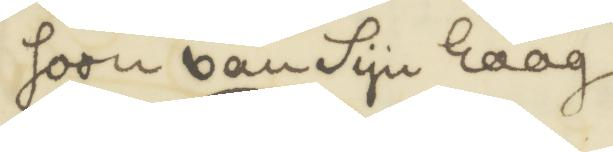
soon van sijn hoog
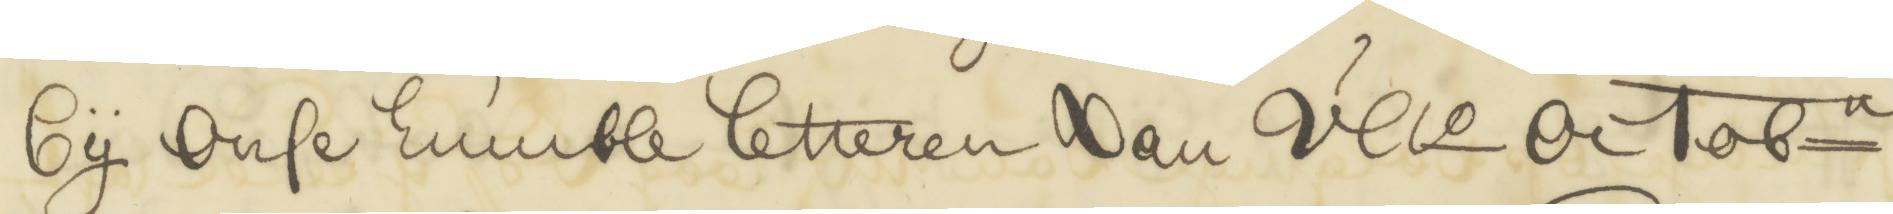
bij onse humble letteren van Ult-o Octob=r
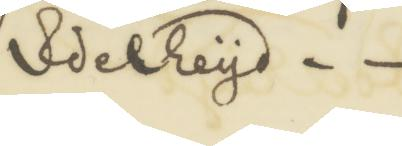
Edelheijd -
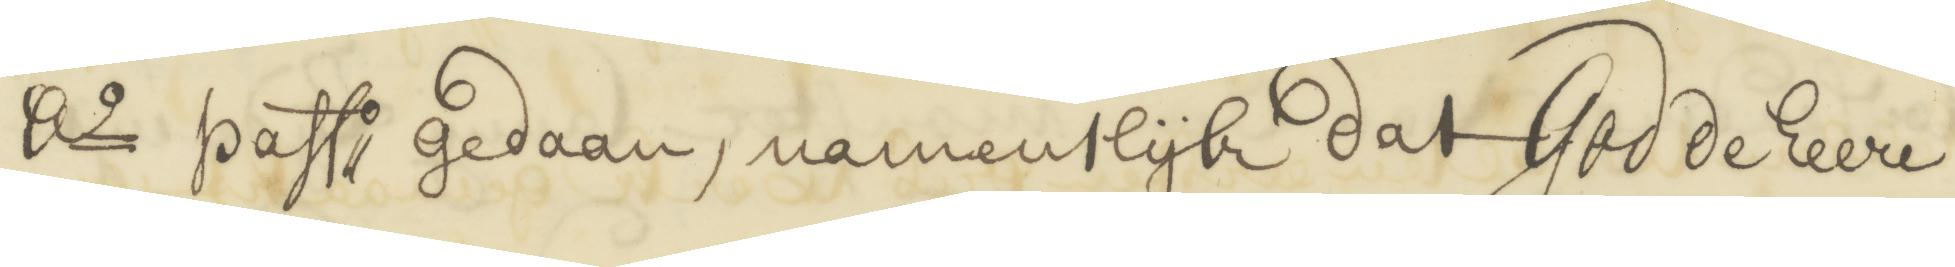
a=o pass„o gedaan, namentlijk dat God de heere
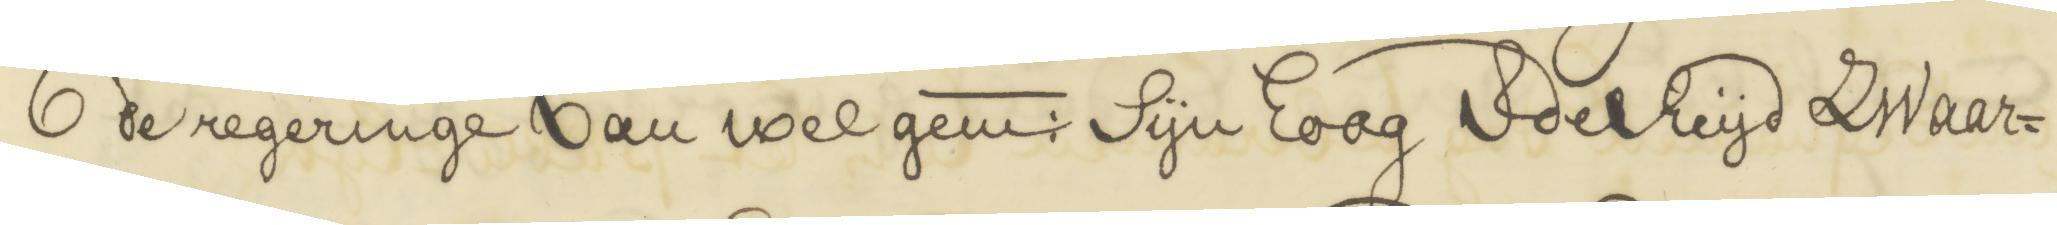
de regeringe van wel gem: sijn hoog Edelheijd zwaar=
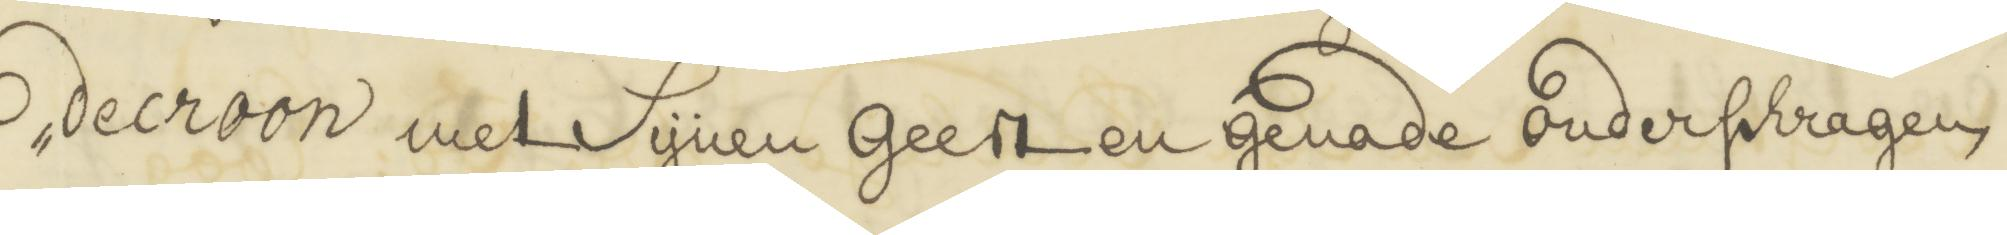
„decroon met sijnen geest en genade onderschragen,
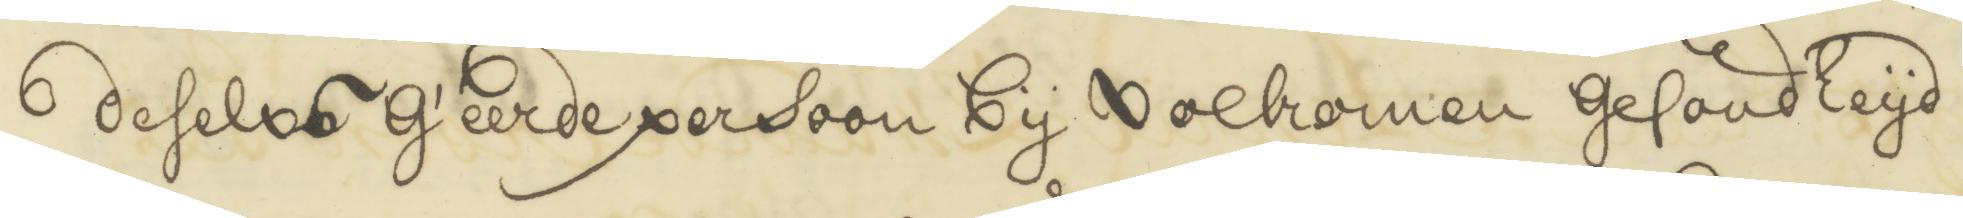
deselvs g’eerde persoon bij volkomen gesondheijd
